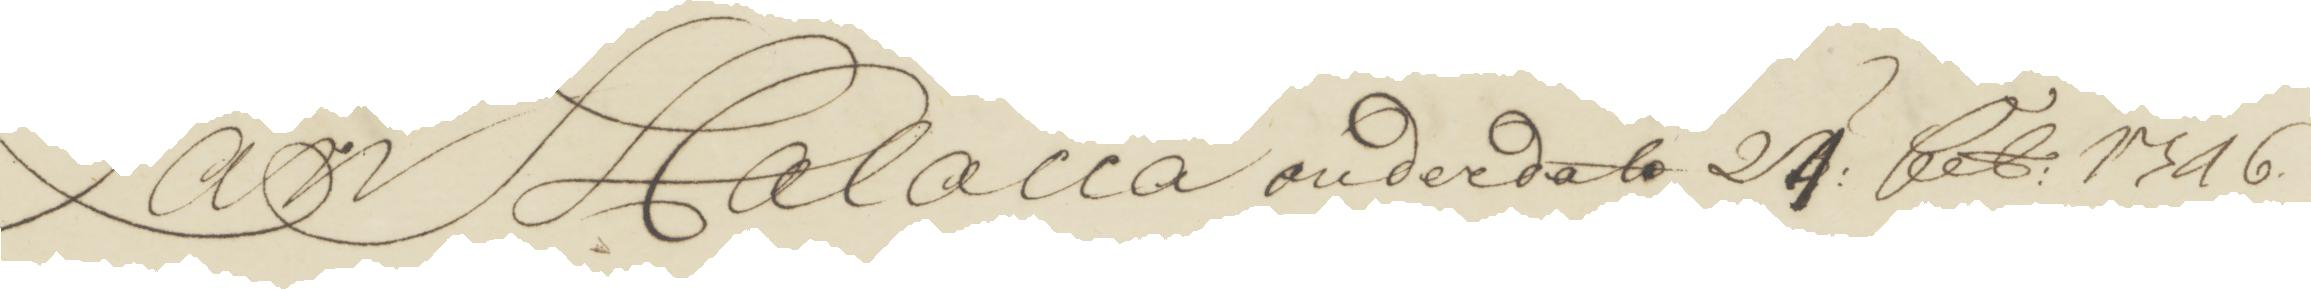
Van Malacca onder dato 24:' feb: 1746.
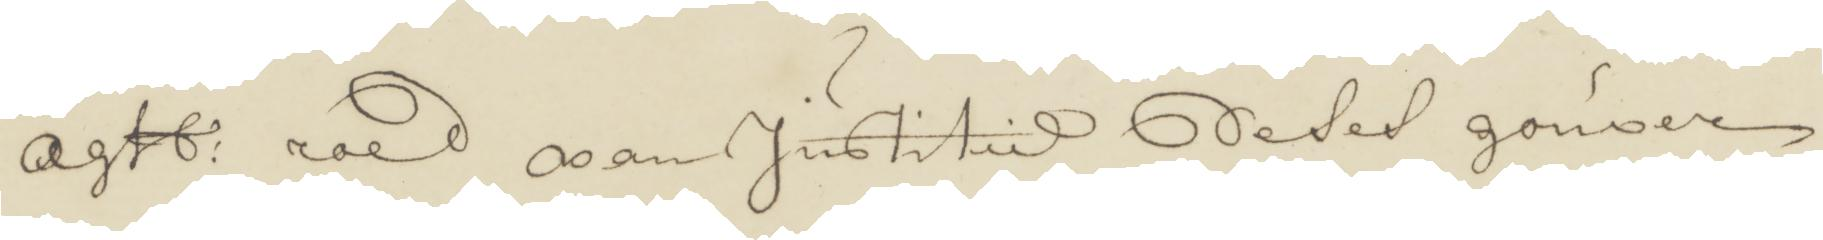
agtb: raed van Justitie deses gouver
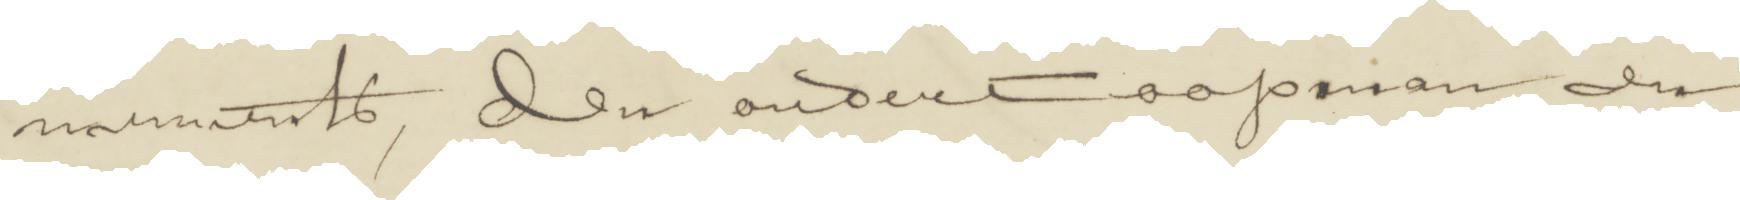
nements, den ondercoopman en
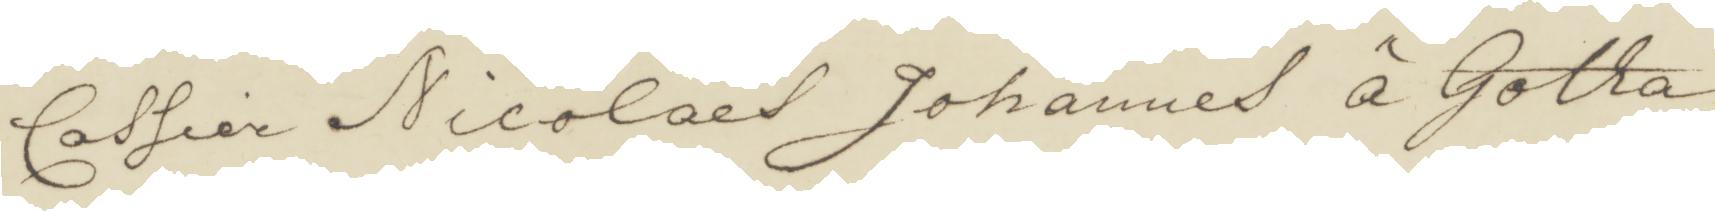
Cassier Nicolaes Johannes â Gotha
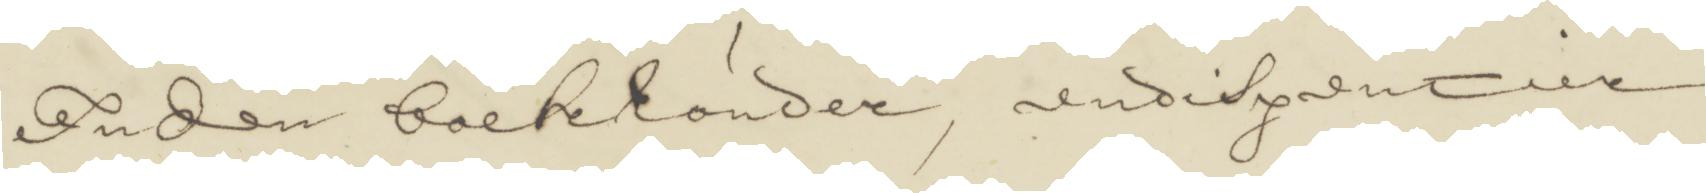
En den boekhouder, en dispencier
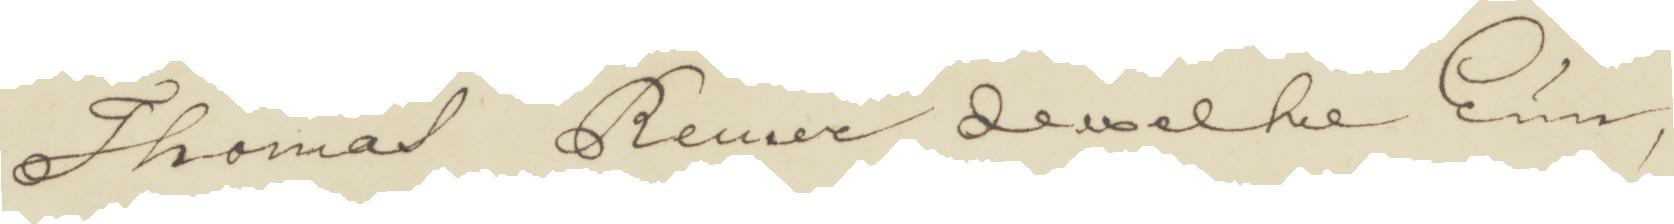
Thomas Remer de welke hun,
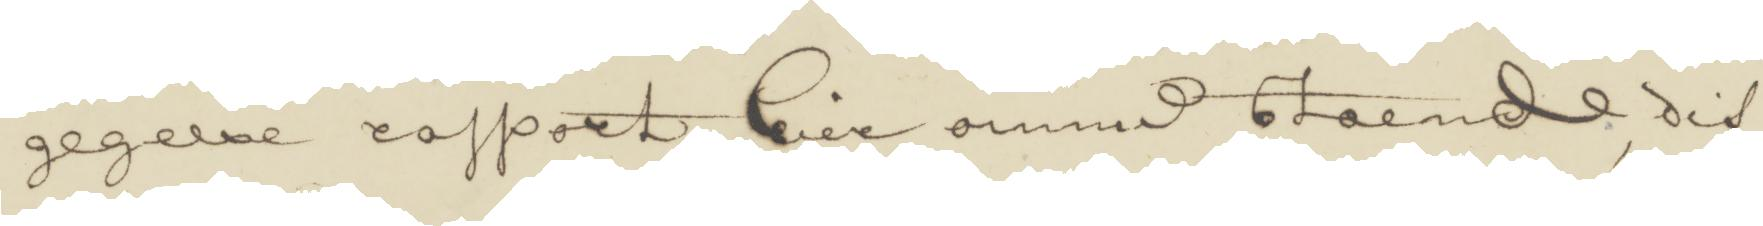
gegeeve rapport hier omme staende, dis
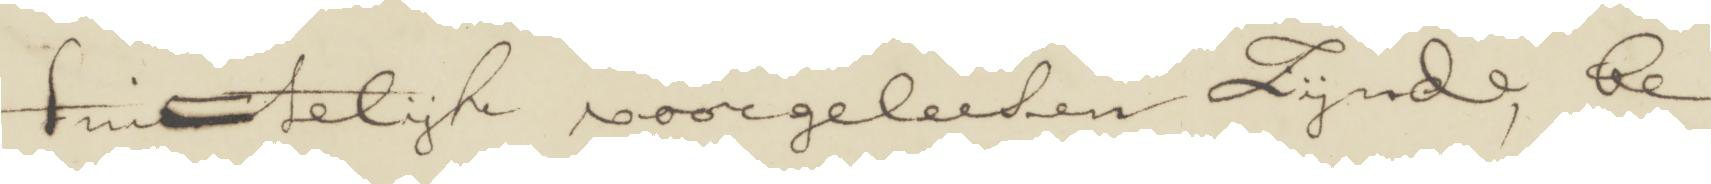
tinctelijk voorgeleesen Zijnde be
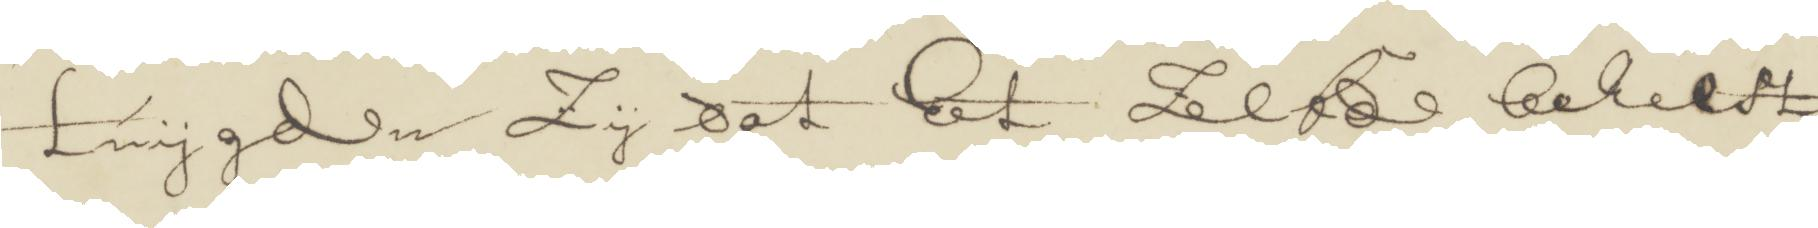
tuijgden Zij dat het Zelfde behelst
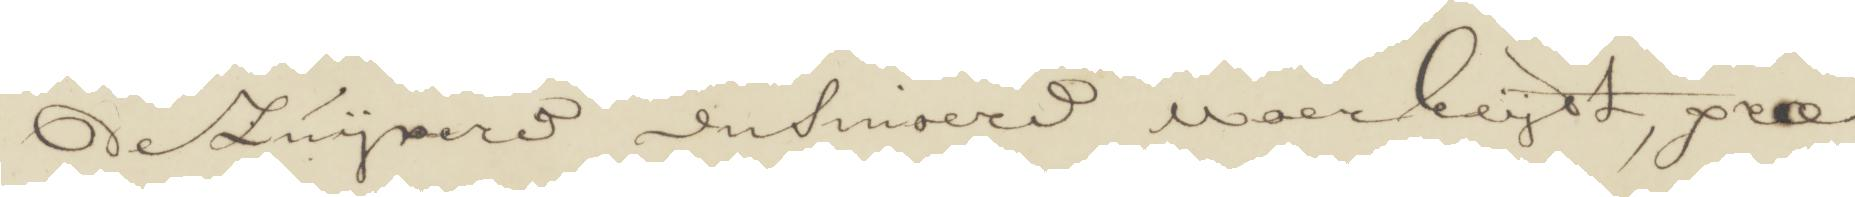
de Zuijvere en Sincere waerheijdt, prae
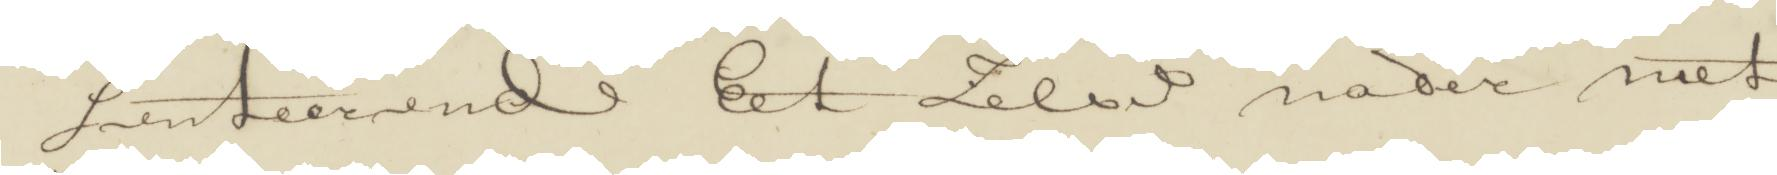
senteerende het Zelve nader met
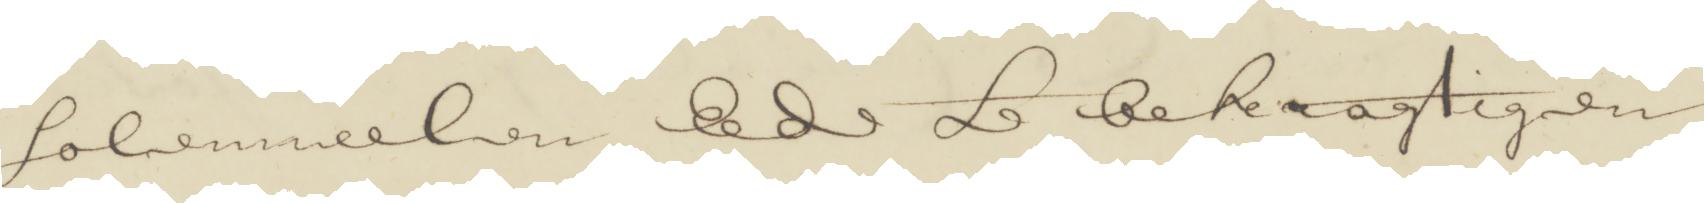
solemneelen Eede te bekragtigen
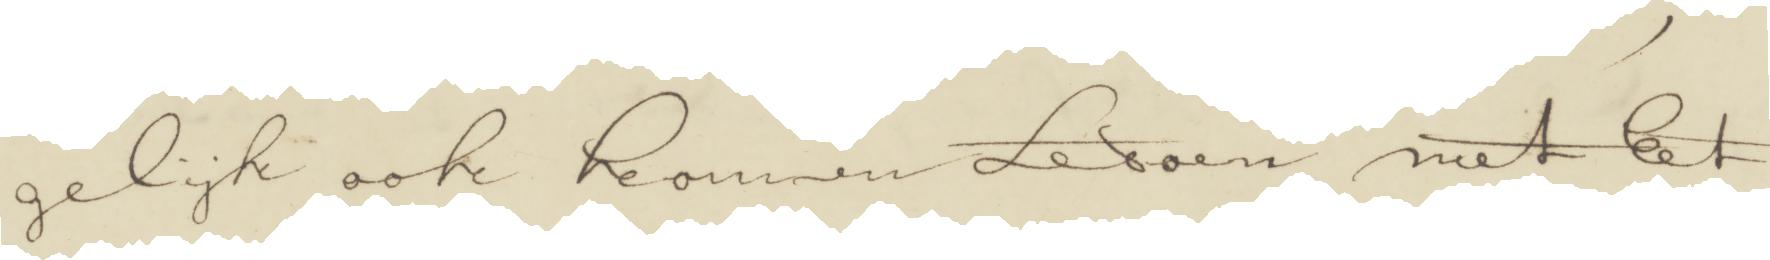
gelijk ook komen te doen met het
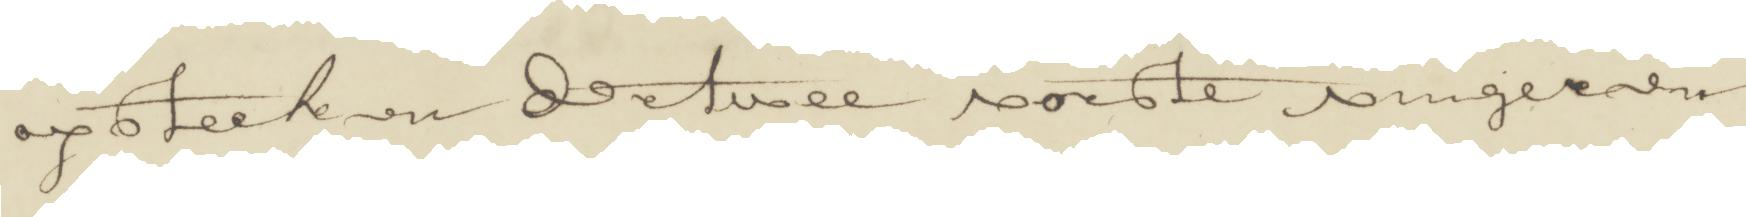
opsteeken der twee vorste vingeren
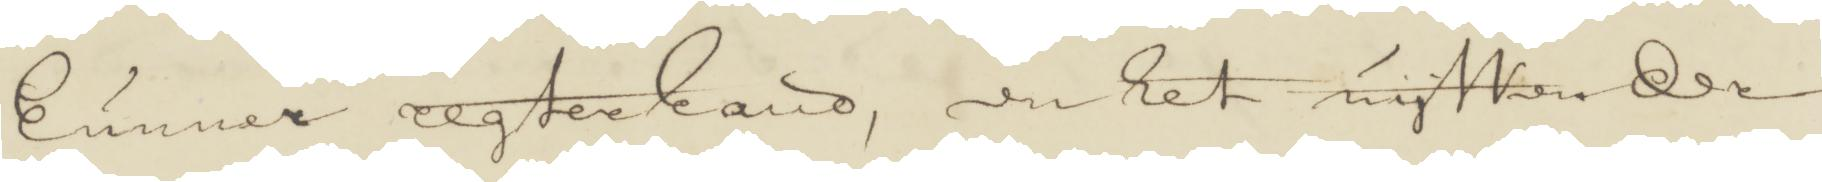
hunner regter hand, en het uijtten der
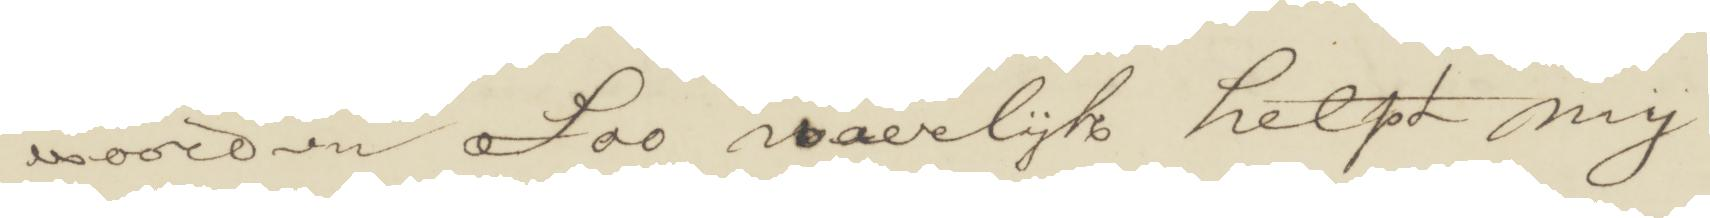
woorden Soo waerlijk helpt mij
